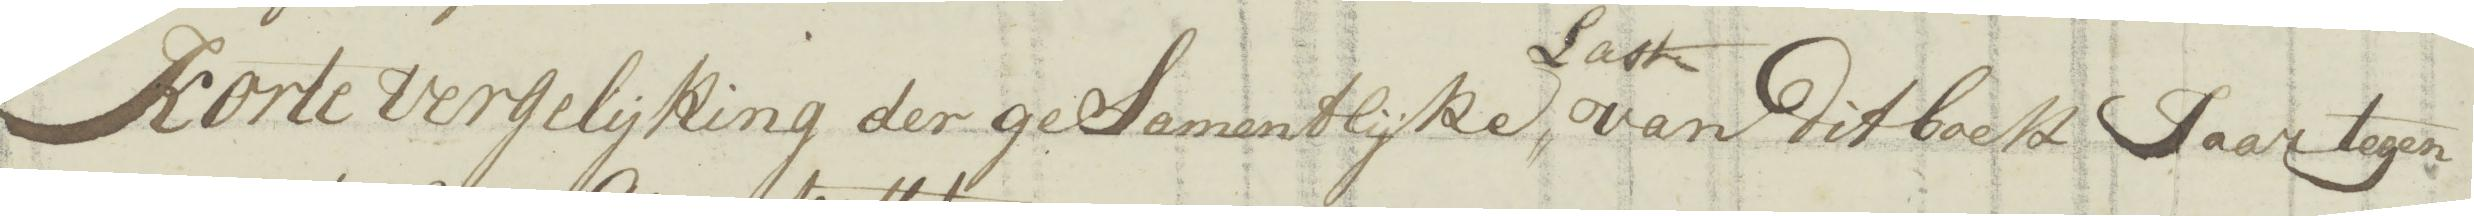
Korte vergelijking der gesamentlijke„ van dit boek Iaar tegen
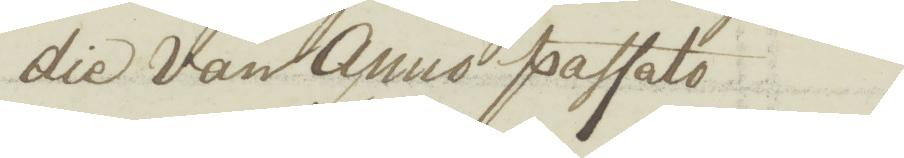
die van Anno passato
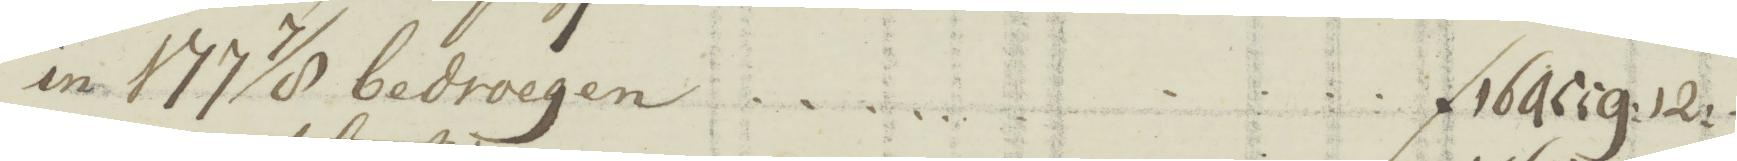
in 177 7/8 bedroegen . . . . . . . - . . . ƒ164559:12:
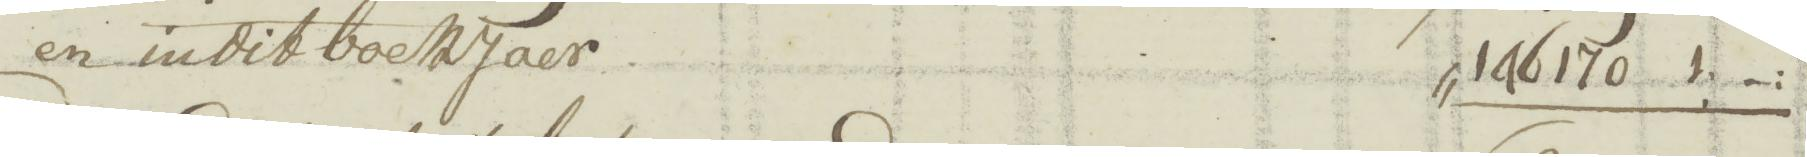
en in dit boekjaer . . . „ 146170: 1: —:
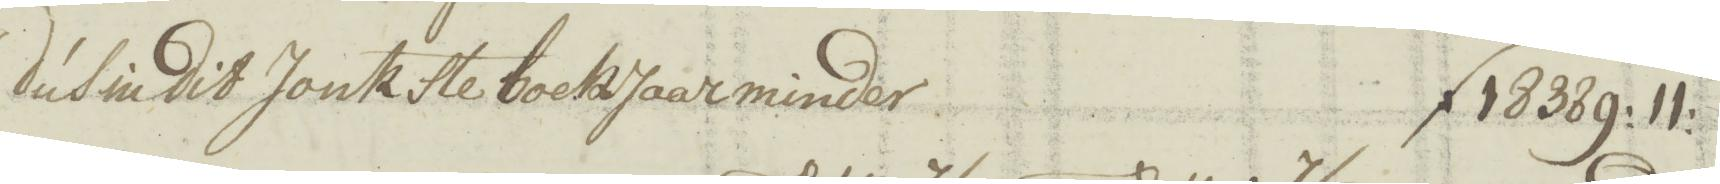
dus in dit Jonkste boekJaar minder ƒ18389:11:
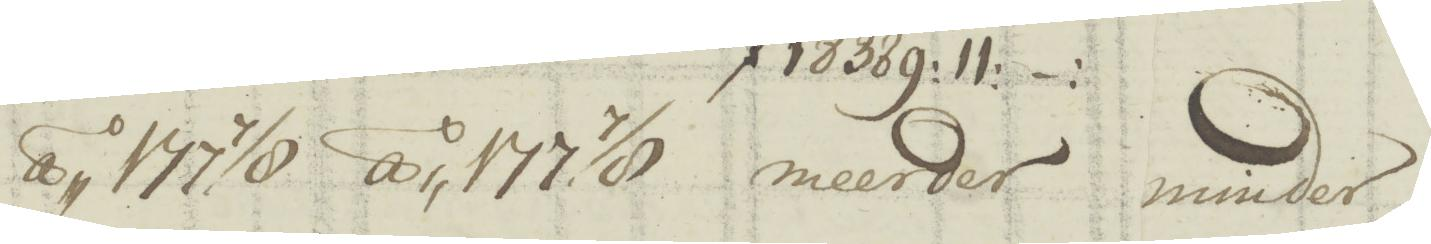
a„o 177 7/8 a„o 177:7/8 meerder minder
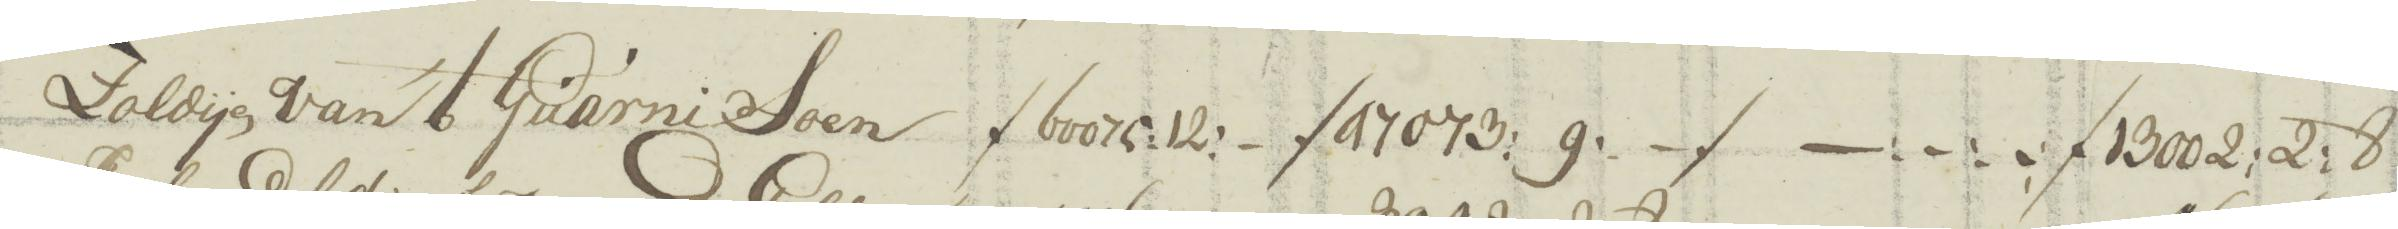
Zoldije van ’t Guarnisoen ƒ 60075:12: ƒ47073: 9: „ -ƒ —: —: -: ƒ 13002:2: 8
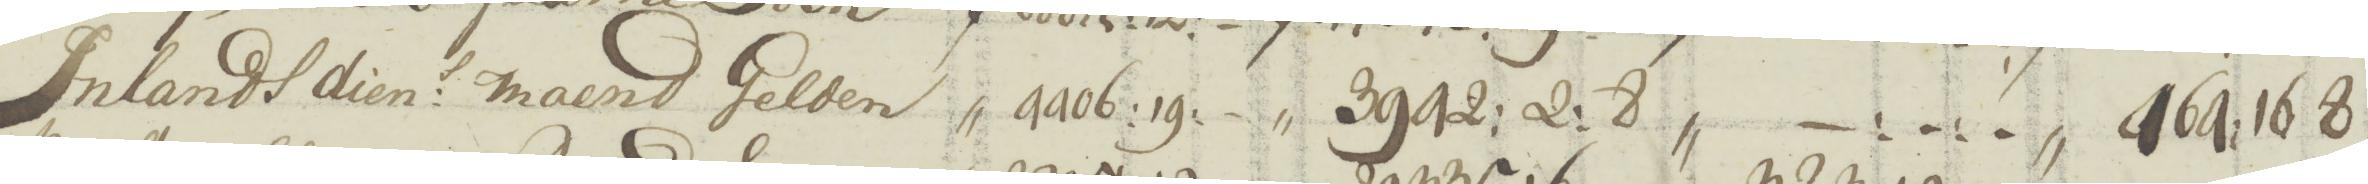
Inlands dien:s maend Gelden „ 4406:19: - „ 3942: 2: 8 „ —: -: -„ 464:16 8
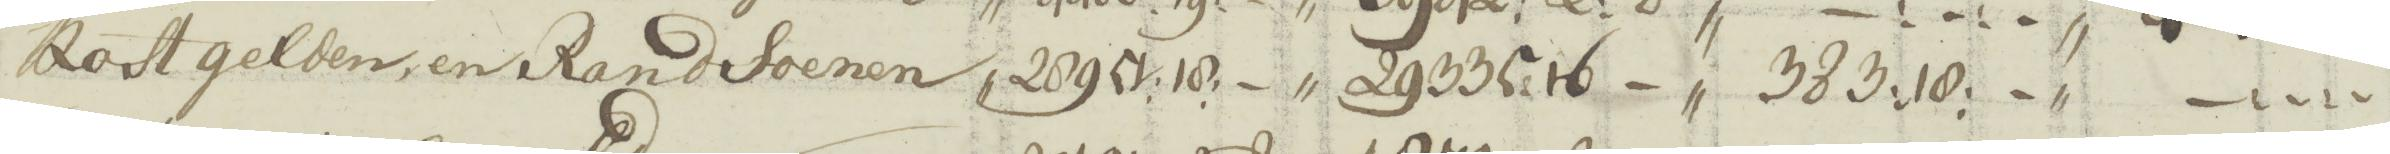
Kostgelden, en Randsoenen „ 28951:18:— „ 29335:16 — „ 383:18: -„ —:-:-
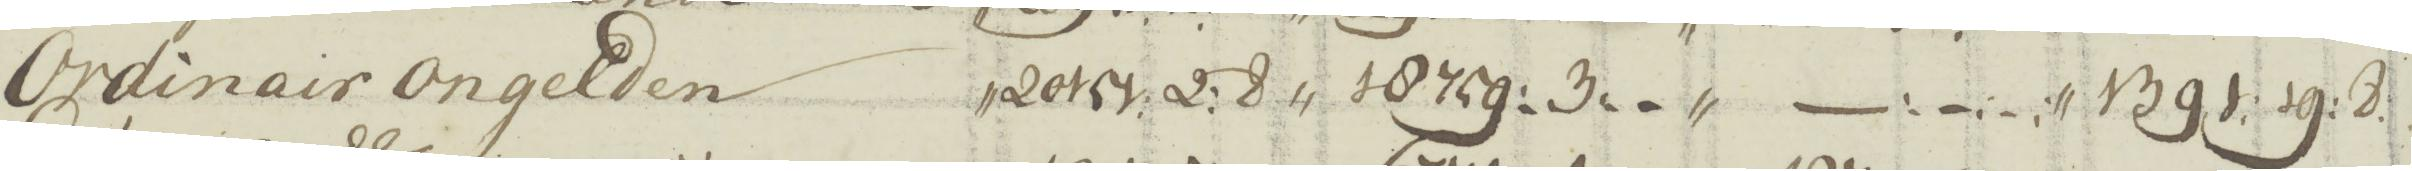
Ordinair ongelden „20151: 2: 8:„ 18759: 3: - „ —:-:-:„1391:19:8:
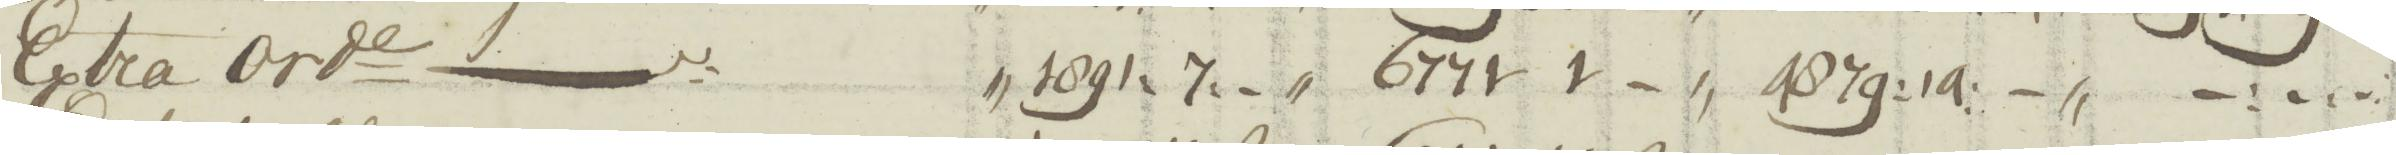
Extra ord=l _=o „1891:7: —„ 6771 1 - „ 4879:14: —„ —:-:-:
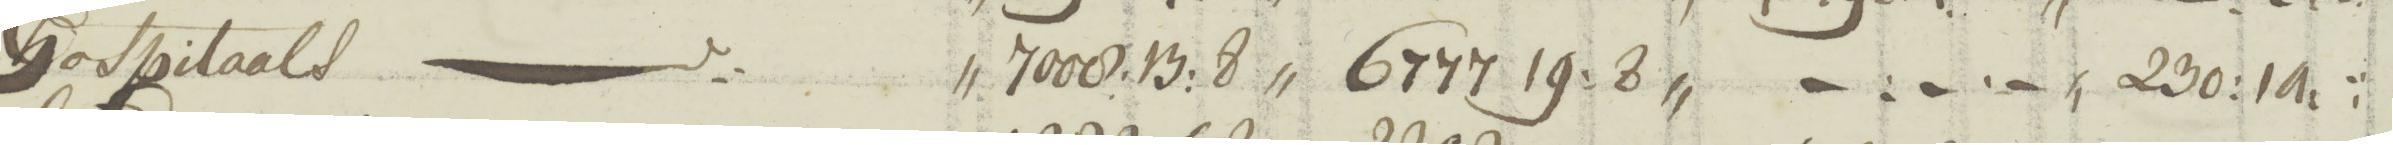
Hospitaals _=o „7008:13:8 „ 6777:19:8 „ —: —: — „ 230: 14: :
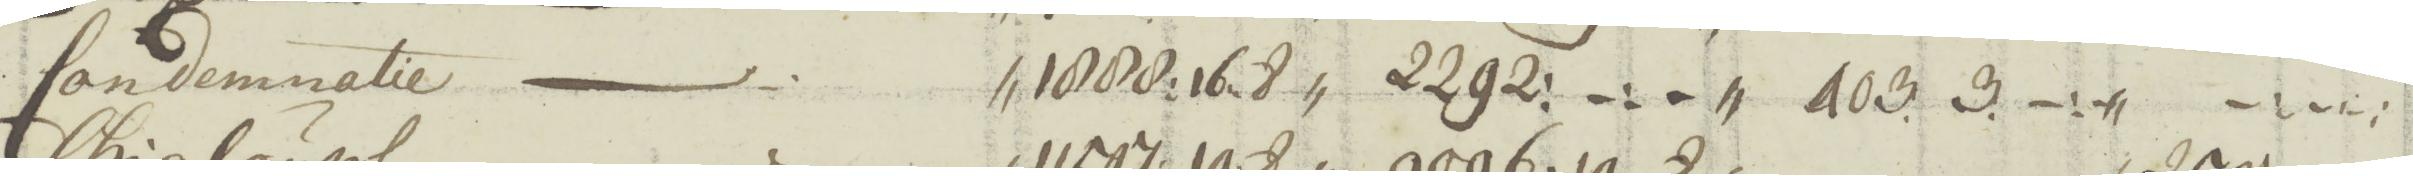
Condemnatie _-. „1888:16:8„ 2292: —: — „ 403: 3: —: -„ —:-:-:
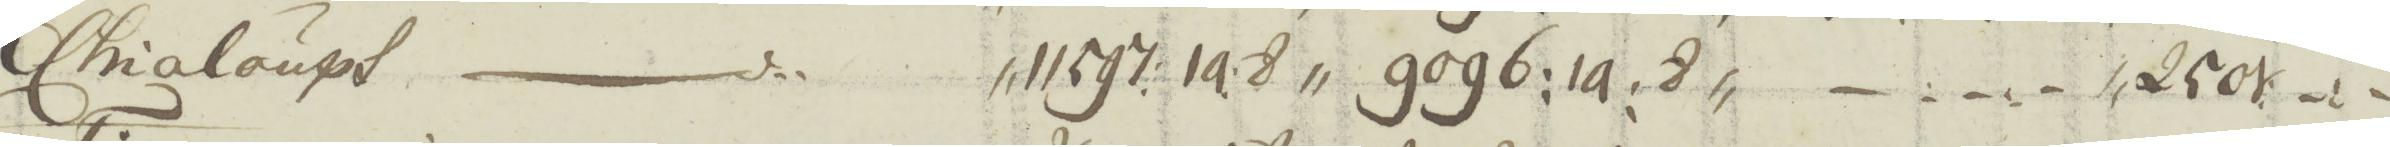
Chialoups _-- „ 11597: 14.8 „ 9096:14:8 „ —: -: - „2501: -: -
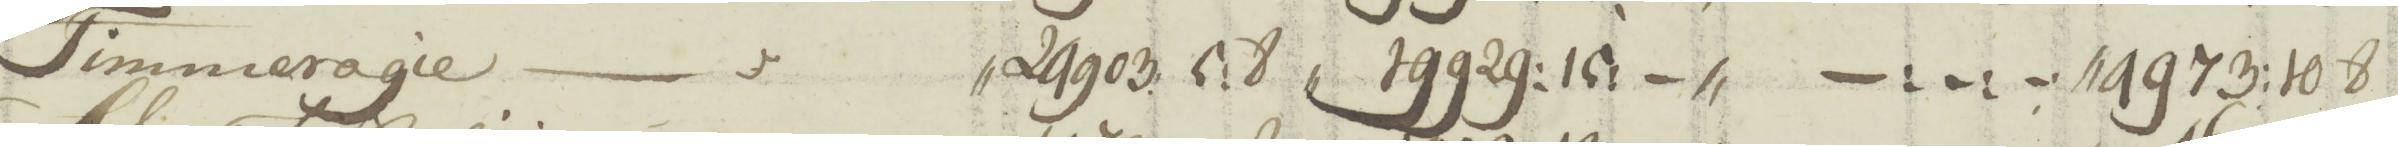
Timmeragie _d „ 24903: 5: 8 „ 19929:15: —„ —: —: —: „4973:10 8
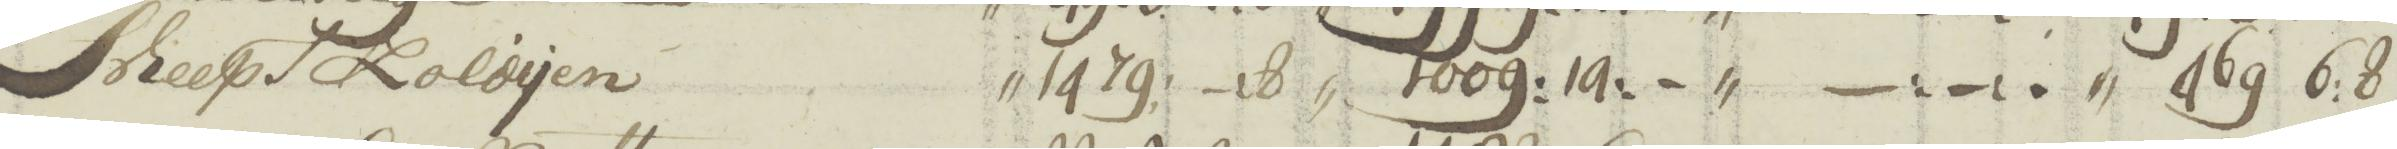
Scheeps Zoldijen „ 1479: -:8 „ 1009:14: -„ —: —:- „ 469 6:8
